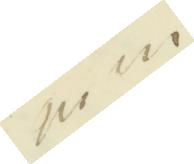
m m
